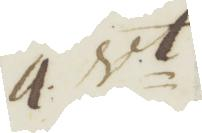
4. v=t
